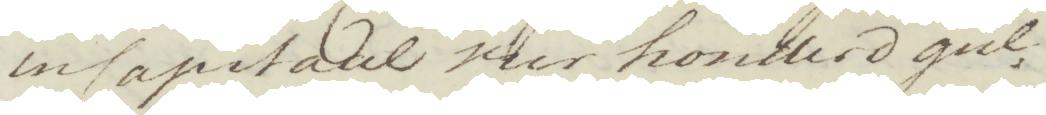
in Capitaal vier honderd gul„
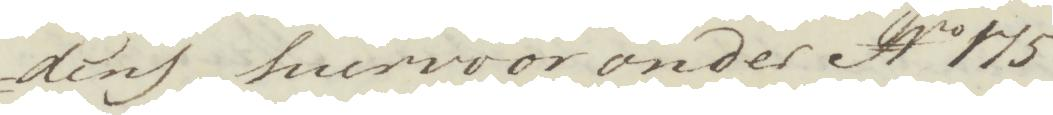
=dens hiervoor onder N=o 175
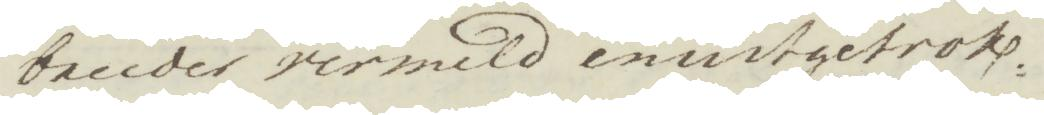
breeder vermeld enuitgetrok:
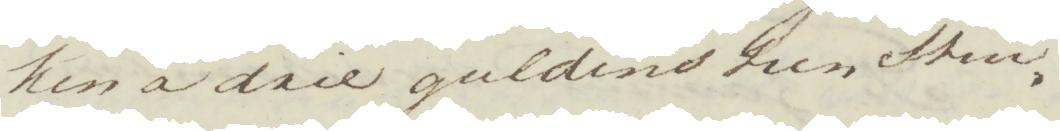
ken a drie guldens tien stui„
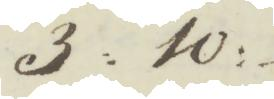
3 : 10:-
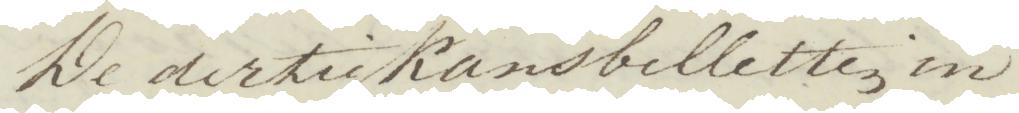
De dertig Kansbilletten in
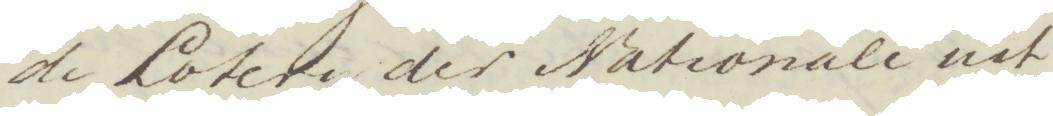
de Lotery der Nationale uit
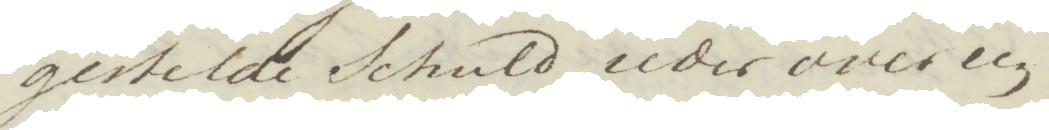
gestelde Schuld ieder over een
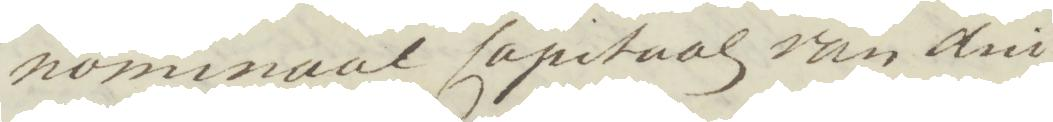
nominaal Capitaal van dui,
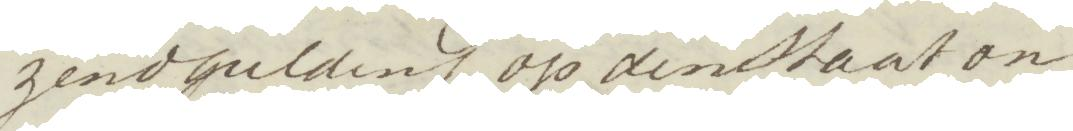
zend guldens, op den Staat on:
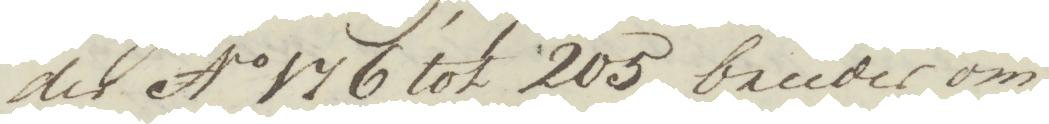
der N=o 176 tot 205 breeder om.
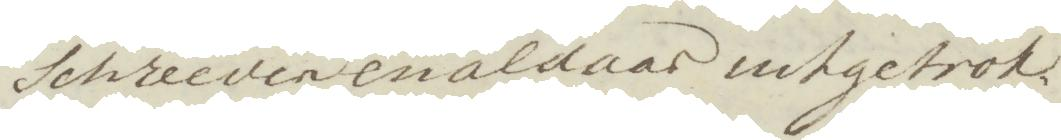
schreeven en aldaar uitgetrok„
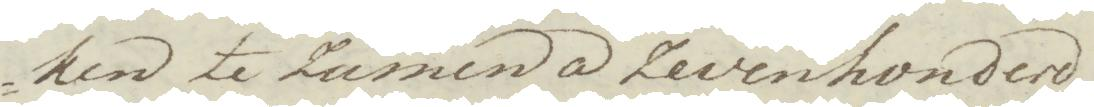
=ken te zamen a zevenhonderd
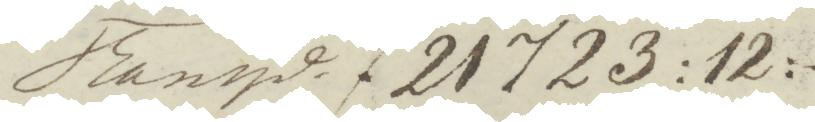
Transp„t ƒ 21723 : 12:
